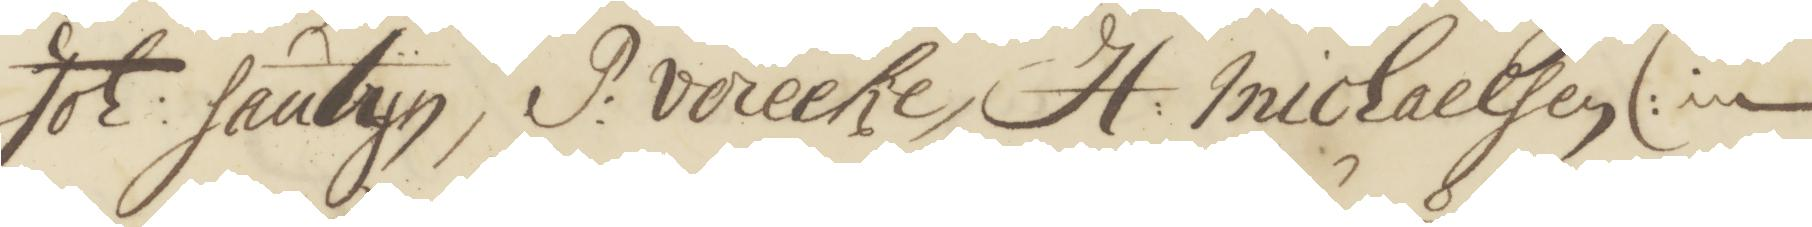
Joh: sautijn, P: vereeke, H: michaelsen (: in
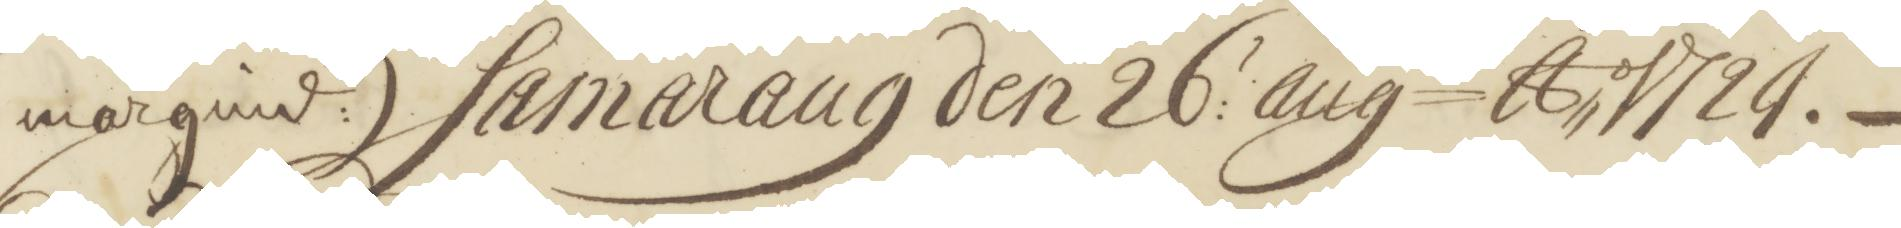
margine: ) Samarang den 26:' aug=o A„o 1724. —
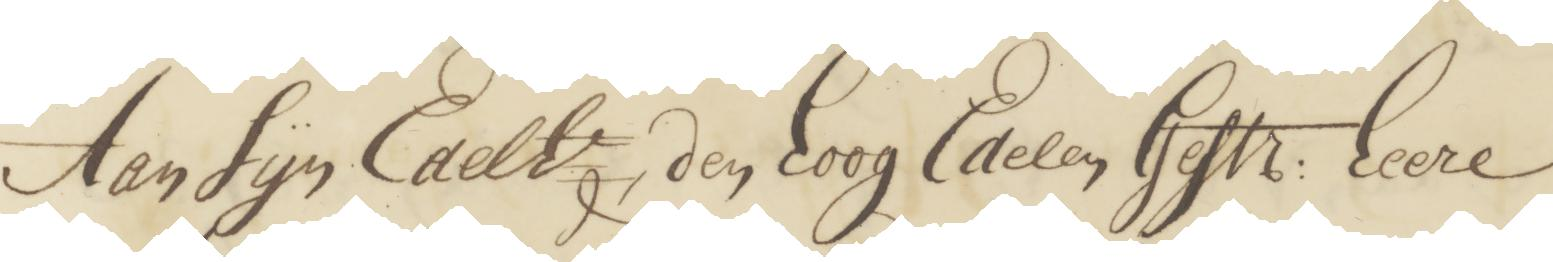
Aan sijn Edelh=t, den hoog Edelen Gestr: heere
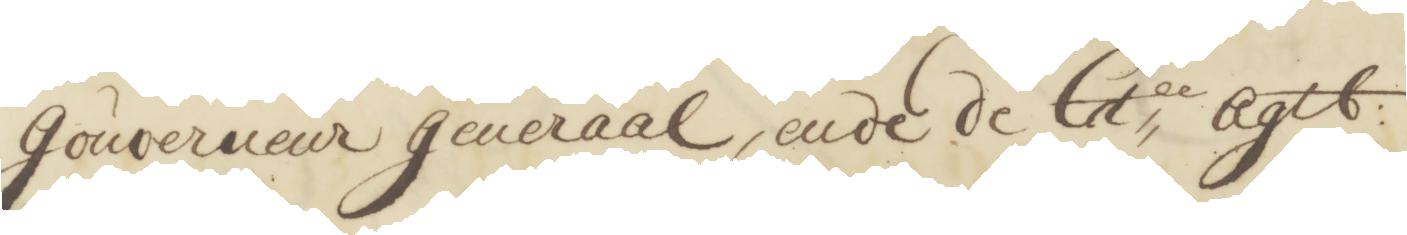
gouverneur generaal, ende de Ed„el agtb:
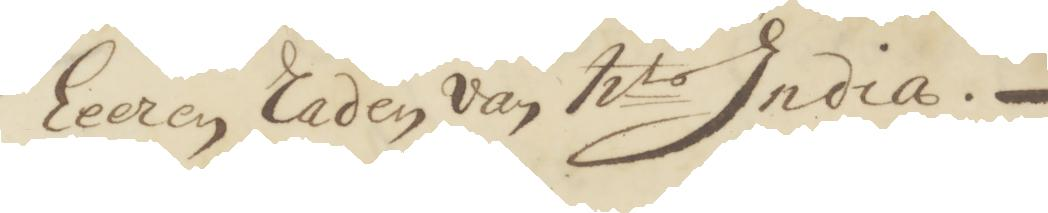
heeren Raden van N=t Jndia. —
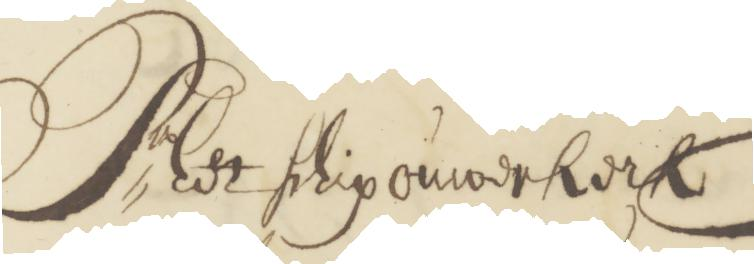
P„r het schip ouwerkerk
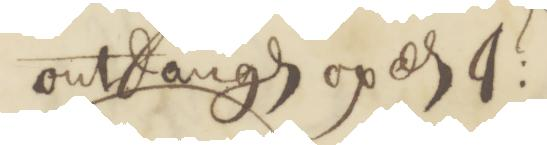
ontfangen op den 4:'
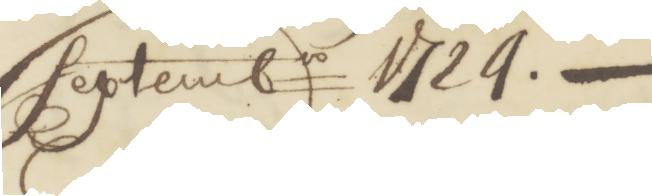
septemb=r 1724. —
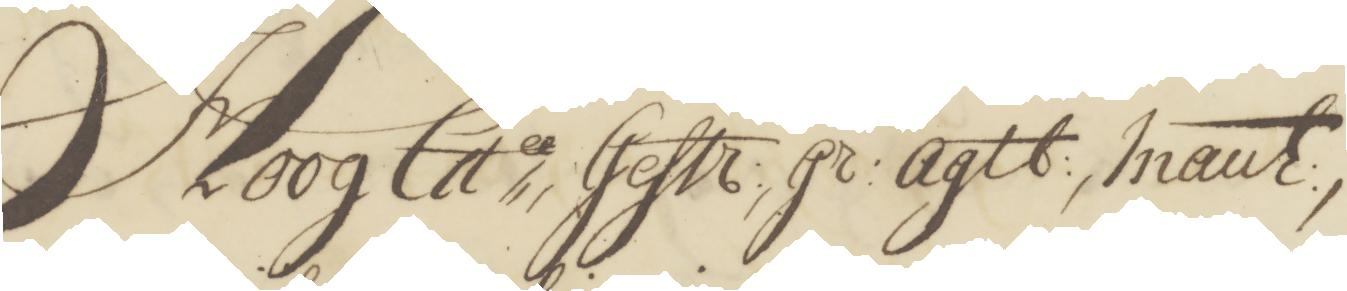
Hoog Ed„le Gestr:, gr: agtb:, manh:,
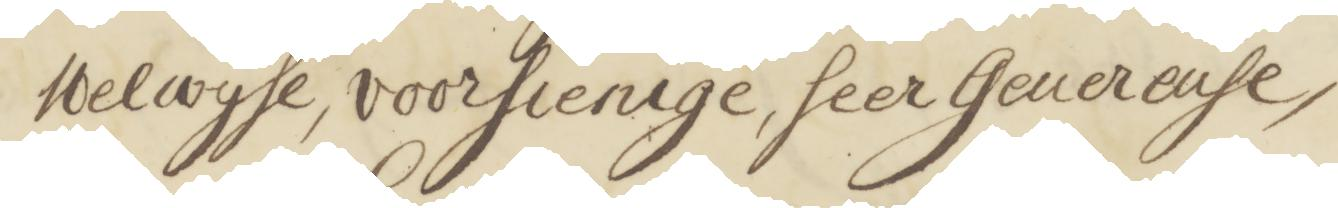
welwijse, voorsienige, seer Genereuse,
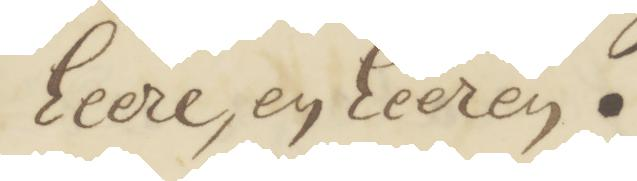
heere, en heeren.
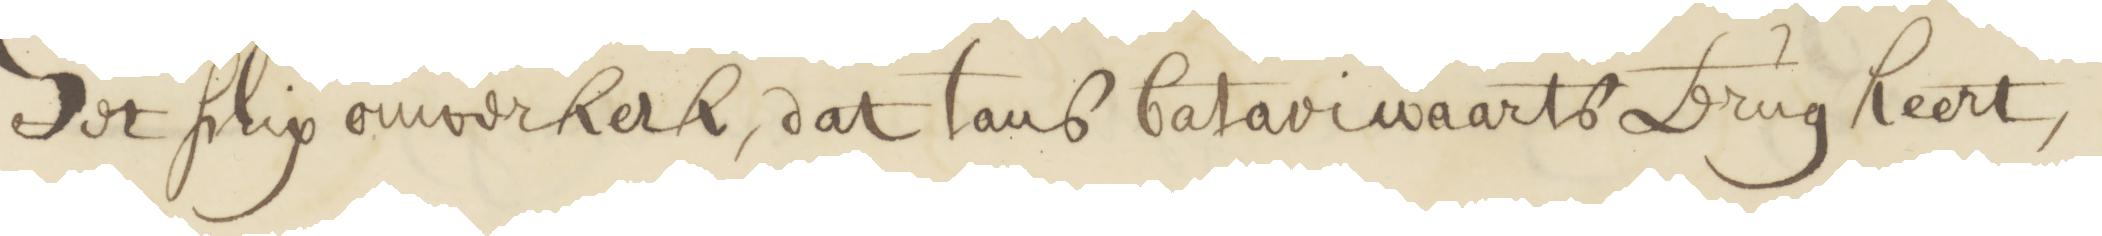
Het schip ouwerkerk, dat tans batavi waarts terug keert,
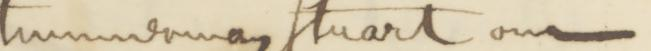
timmerman Stuart om
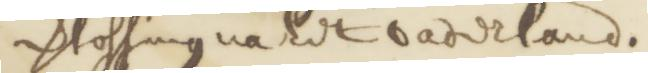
verlossing na het vaderland.
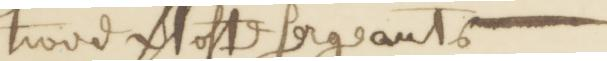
twee verloste sergeants
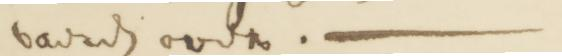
vaeren over. —
